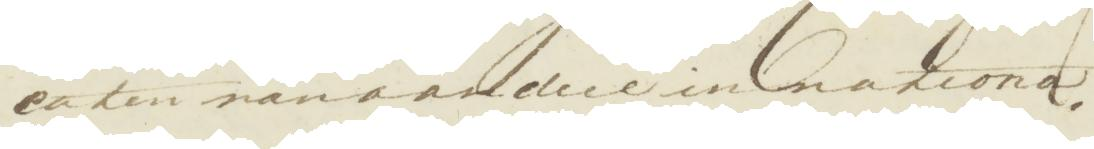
caten van aandeel in nationa„
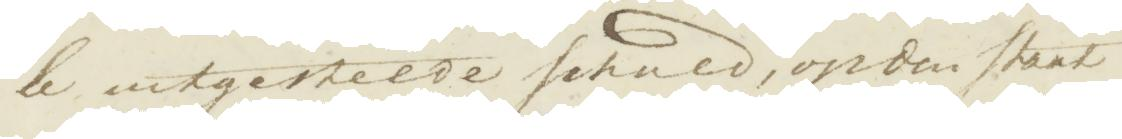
le uitgestelde schuld, op den Staat
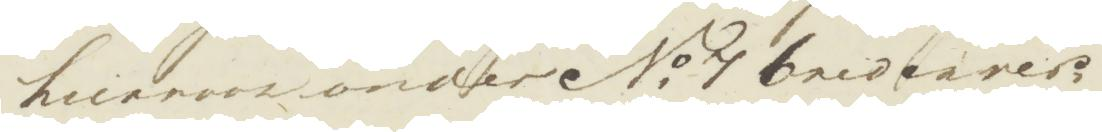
hiervoor onder N.o 7 breder ver=
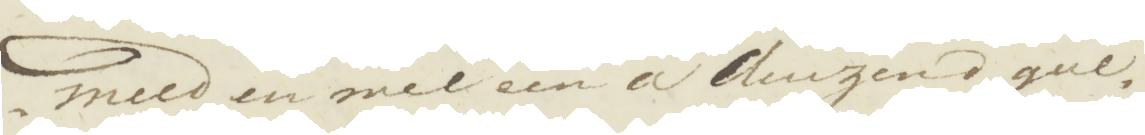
meld en met een a duizend gul„
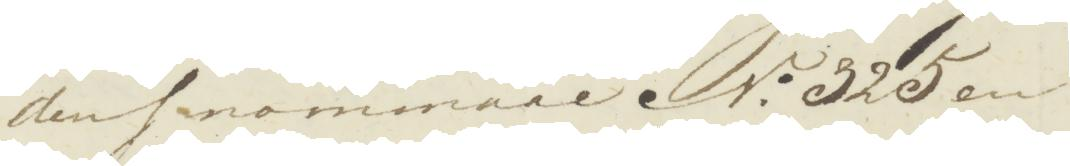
dens nominale N.o 325 en
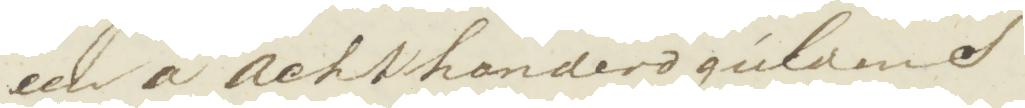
een a acht honderd guldens
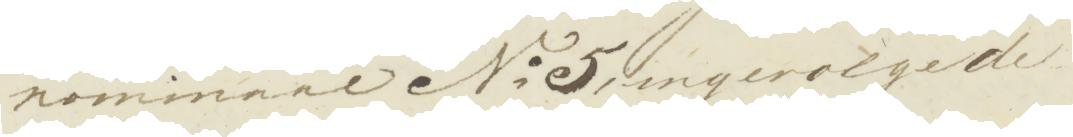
nominaal N.o 5, ingevolge de
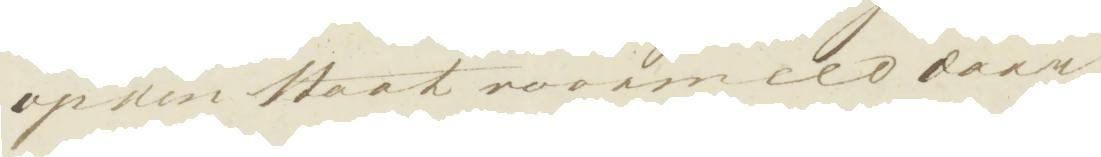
op den Staat voormeld daar
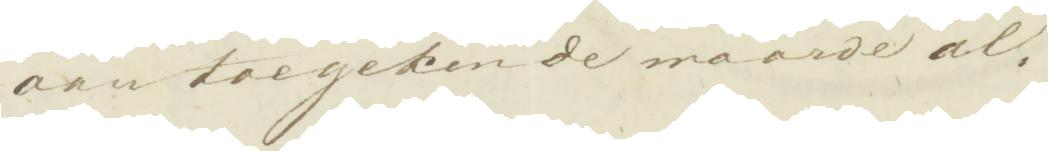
aan toegeken de waarde al„
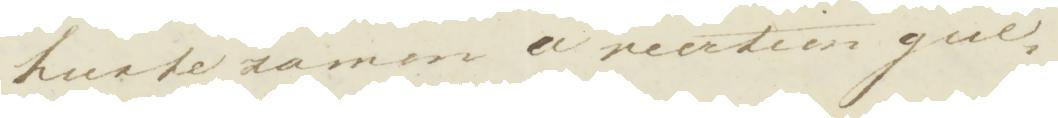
hier te zamen a veertien gul„
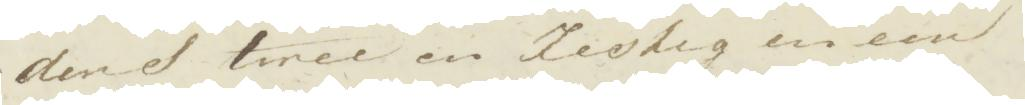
dens twee en Zestig en een
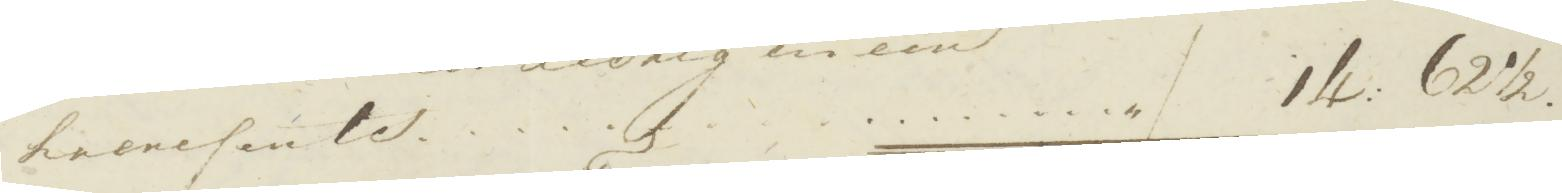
halve Cents. . . . . . . . . . . . . . . . . . . . „ 14: 62½.
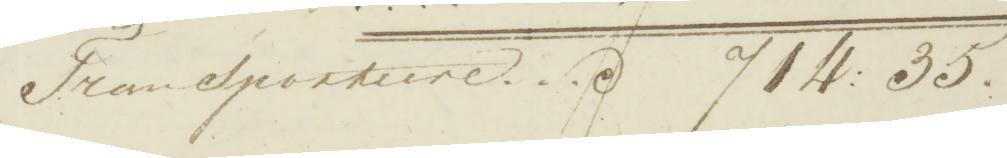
Transporteere. . . ƒ 714: 35.
